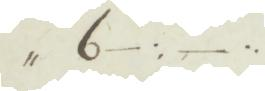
„ 6 —: —.
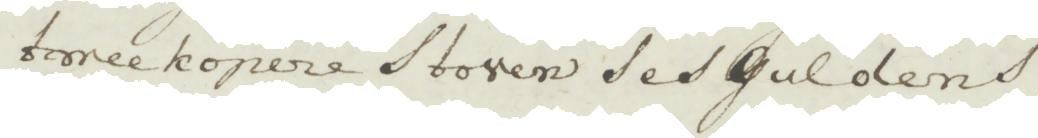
twee kopere stoven ses Guldens
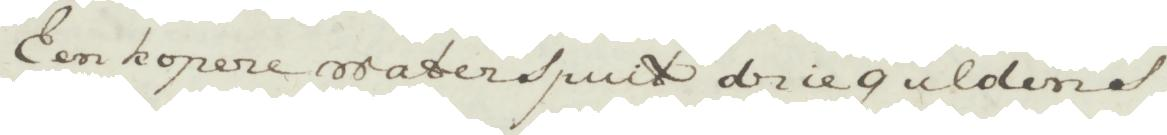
Een kopere waterspuit drie guldens
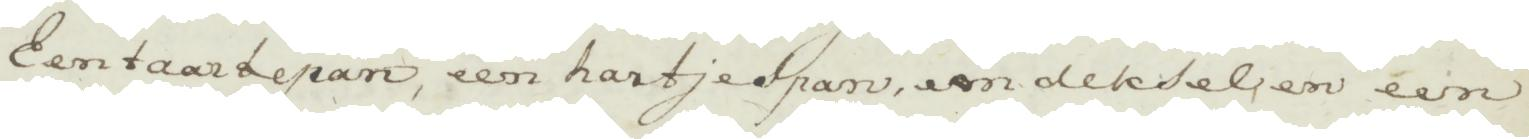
Een taartepan, een hartjespan, een deksel en een
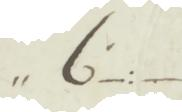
„ 6 —: —
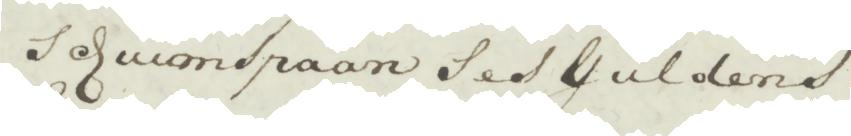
schuimspaan ses Guldens
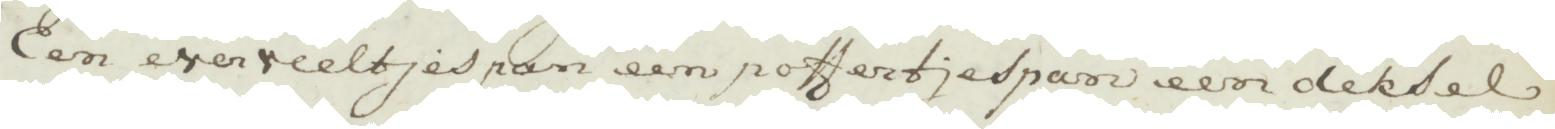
Een evenveeltjespan een poffertjespan een deksel
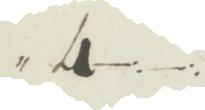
„ 4 —: —.
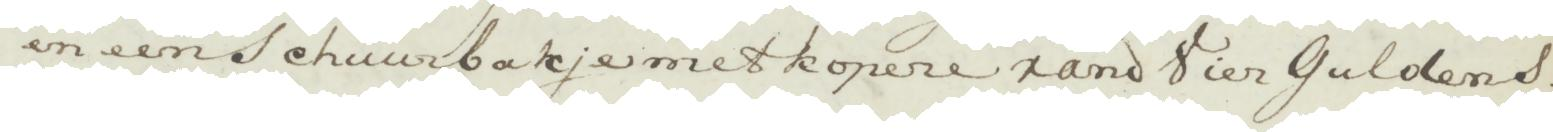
en een schuurbakje met kopere rand Vier Guldens
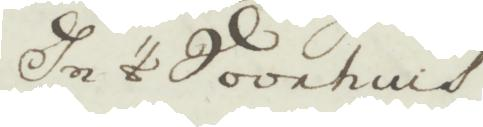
In 't Voorhuis
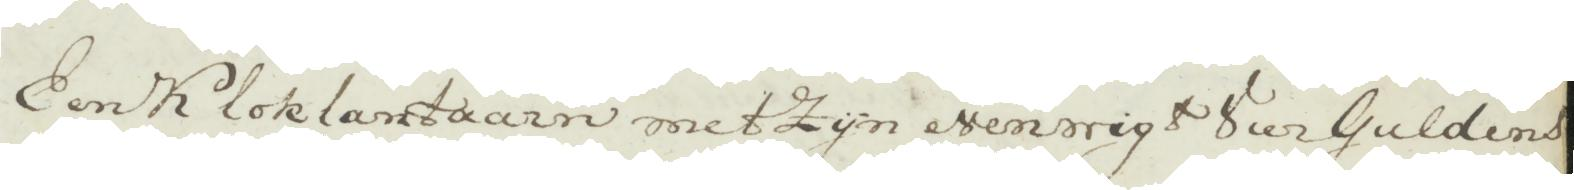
Een Kloklantaarn met zijn evenwigt Vier Guldens
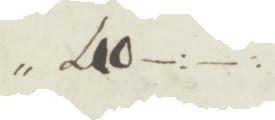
„ 40 —: —:
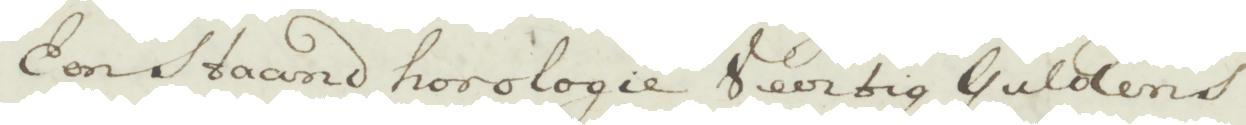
Een staand horologie Veertig Guldens
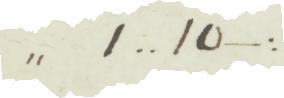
„ 1 .. 10 —.
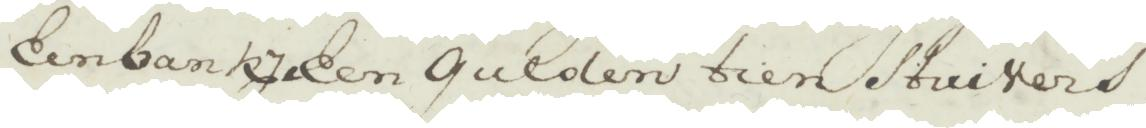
Een bankje Een gulden tien stuivers
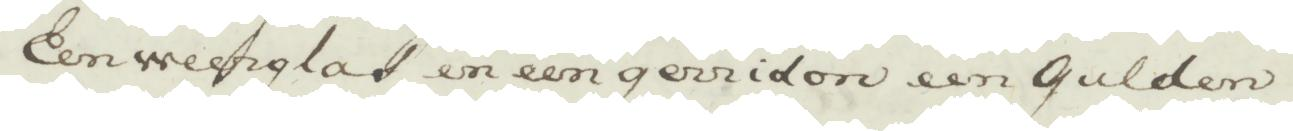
Een weerglas en een gerridon een Gulden
